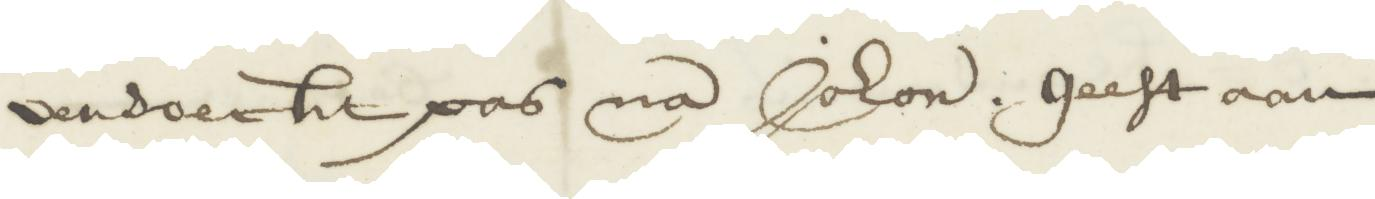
versoeckt pas na johor: geeft aan
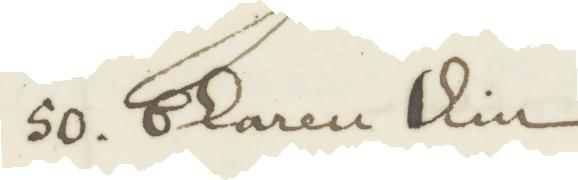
50. bharen thin
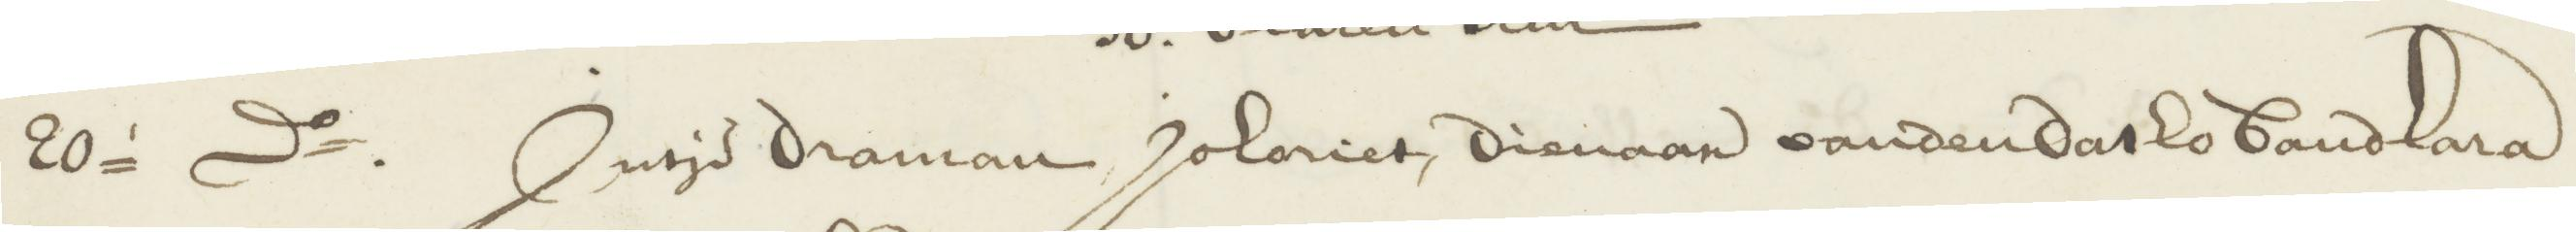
20=' d=o. Jntje draman, johoriet, dienaar van den datho bandhara
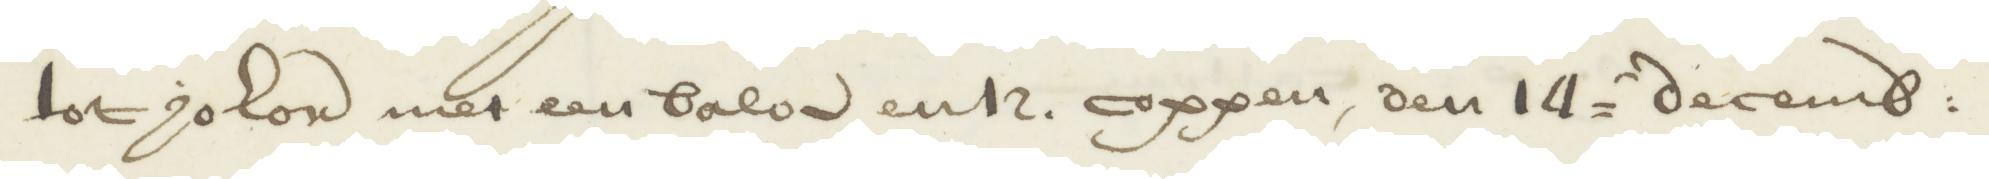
tot johor met een baloe en 12. coppen, den 14=' decemb:
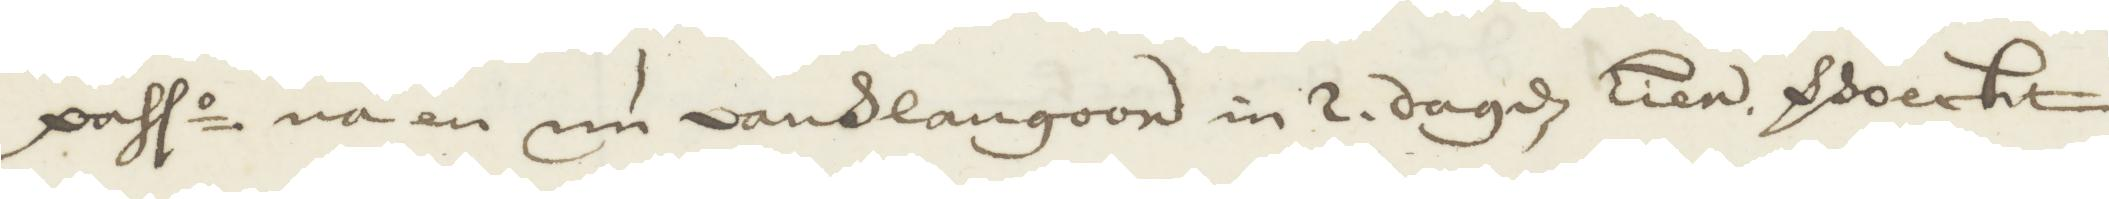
pass=o na en nu van Slangoor in 2. dagen hier. versoeckt
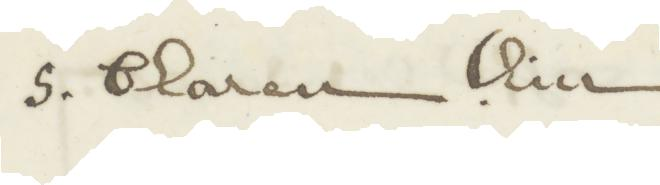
5. bharen thin
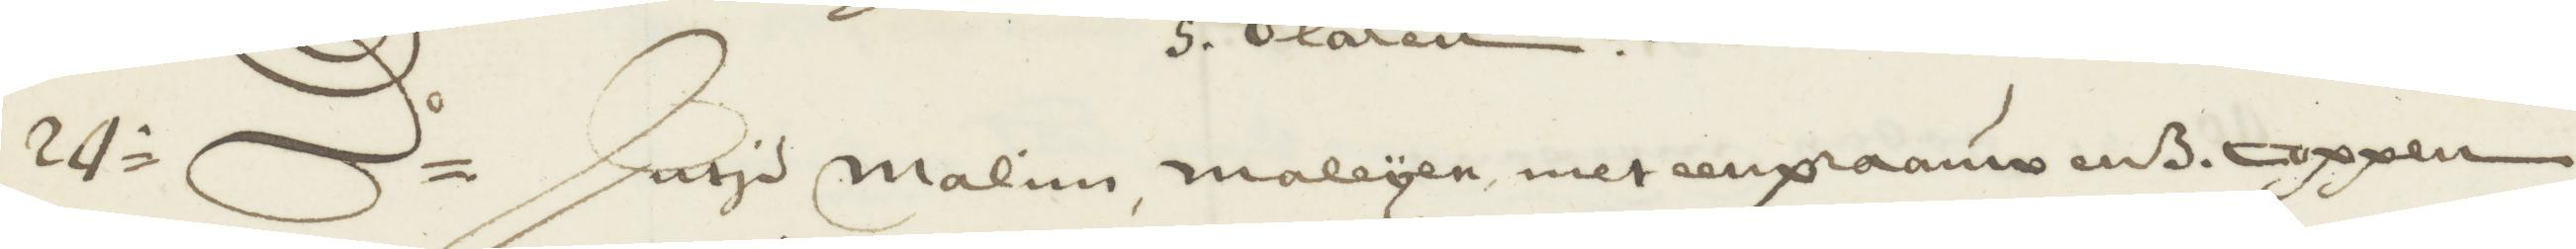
24=' D=o Jntje Malim, maleijer met een praauw en 3. coppen
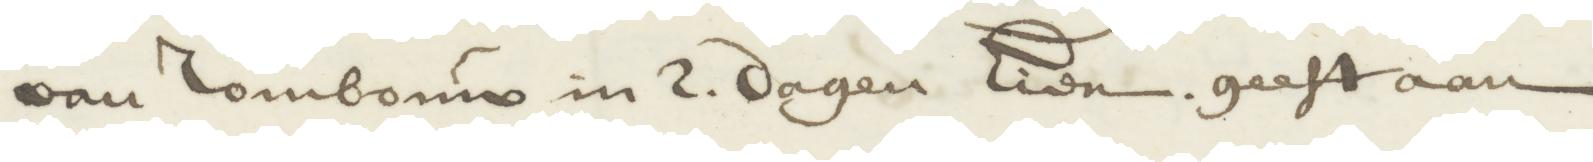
van Rombouw in 2. dagen hier. geeft aan
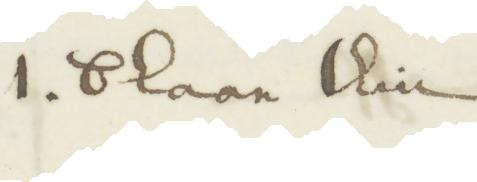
1. bhaar thin
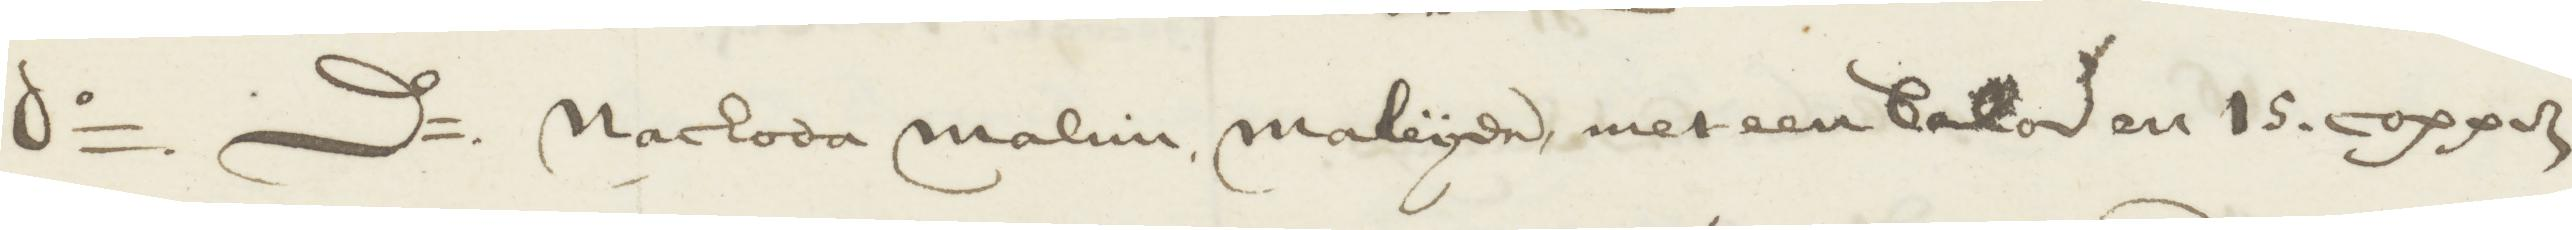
d=o. D=o. Nachoda Malim, Maleijer, met een baloe en 15. coppen
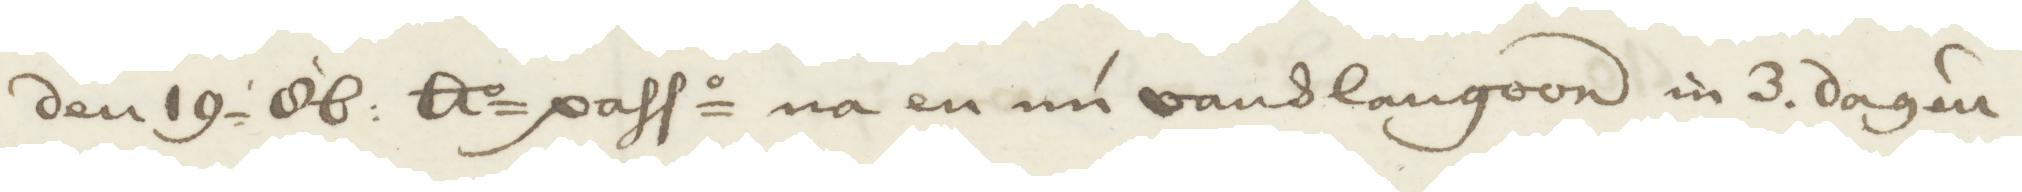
den 19=' 8'b: a=o pass=o na en nu van Slangoor in 3. dagen
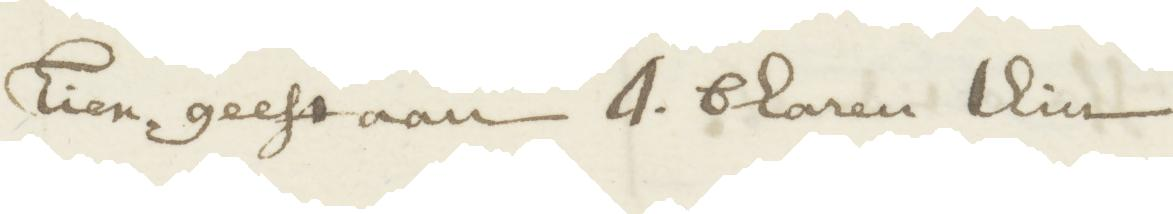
hier geeft aan 4. bharen thin.
